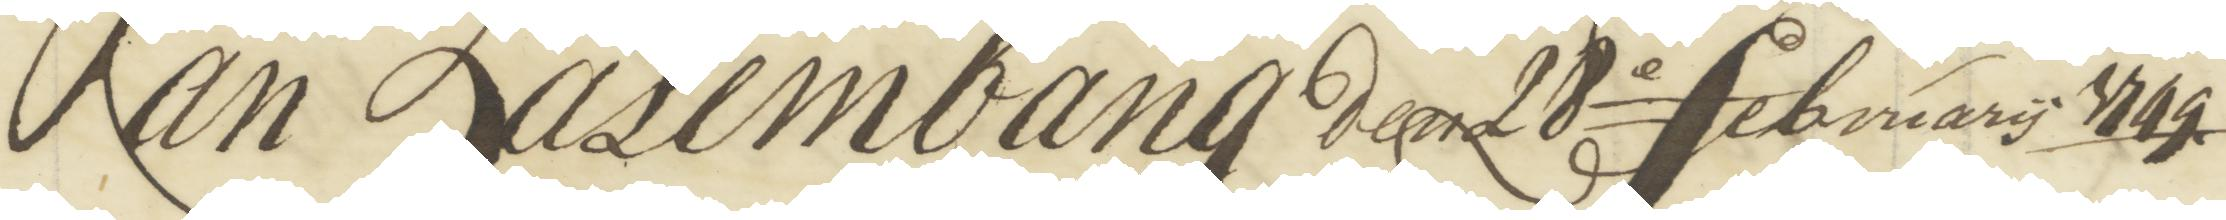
Van Palembang den 28=e Februarij 1749.
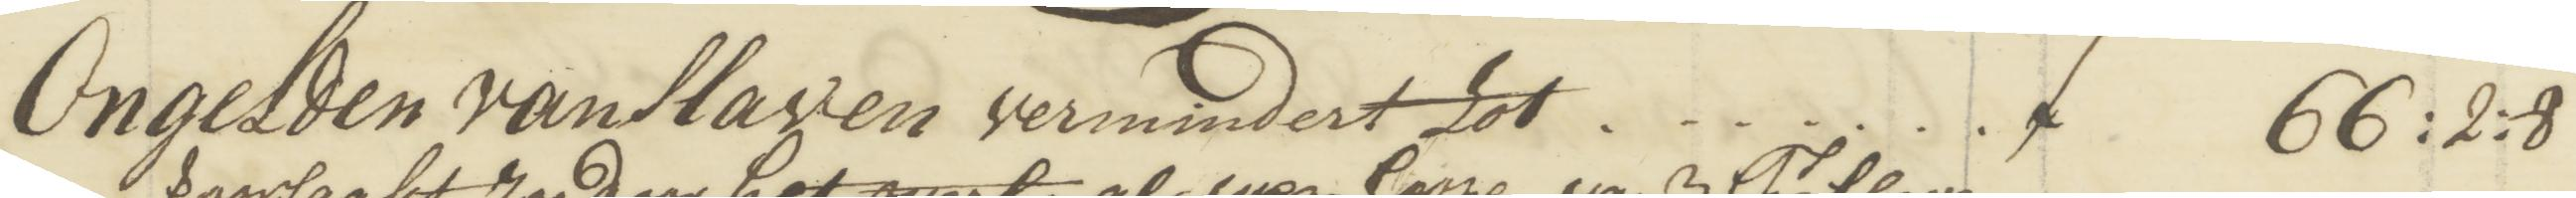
Ongelden van slaven vermindert tot - - - - - - - ƒ 66: 2: 8
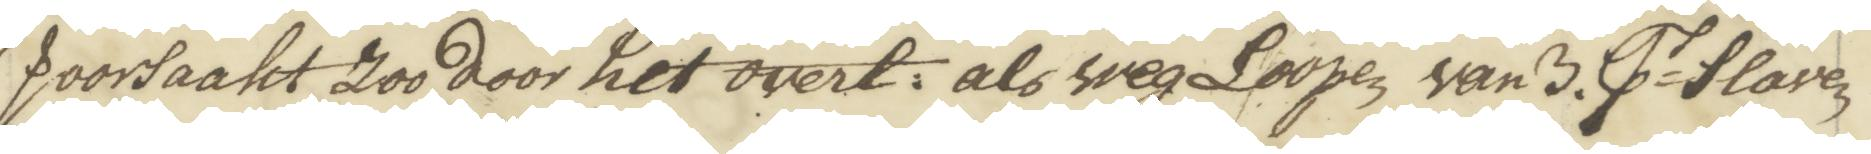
veroorsaakt zoo door het overl: als weg Loopen van 3. P=s slaven
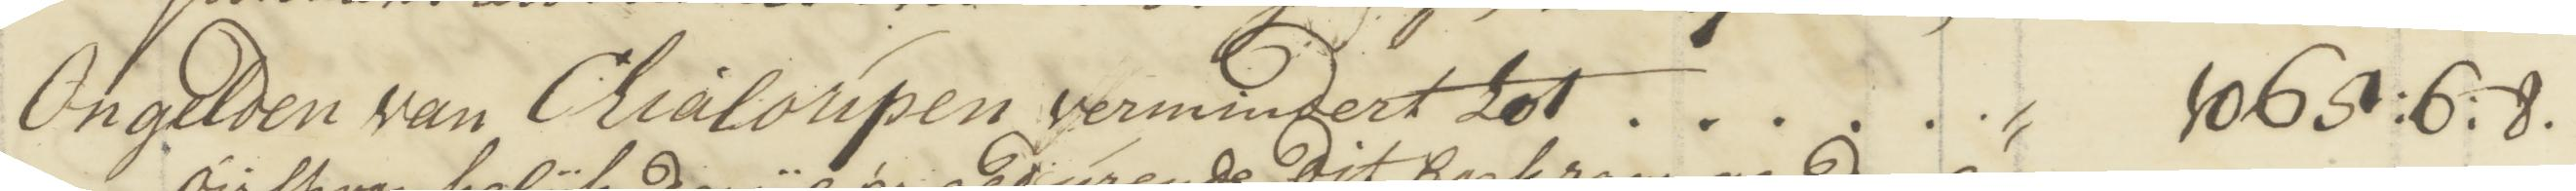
Ongelden van Chialoupen vermindert tot - - - - - - „ 1065: 6: 8.
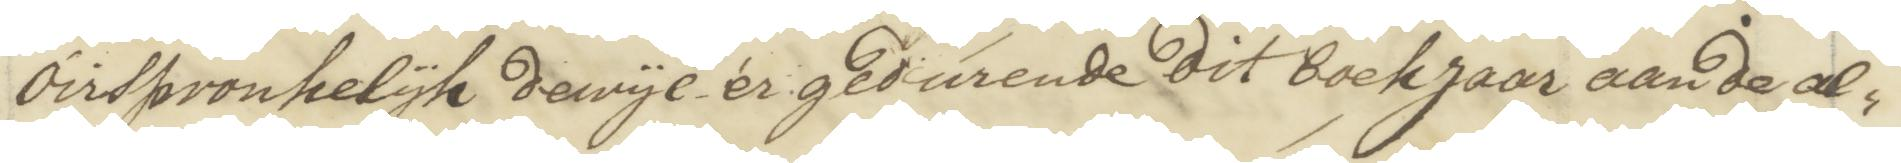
Oirspronkelijk dewijl 'er gedurende dit boekjaar aan de al„
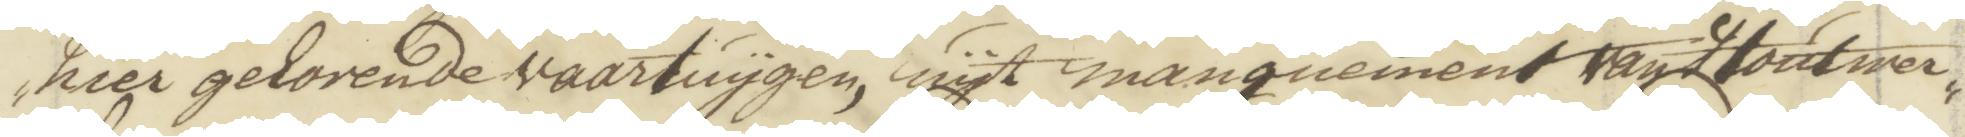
„hier gehorende vaartuijgen, uijt manquement van Houtwer„
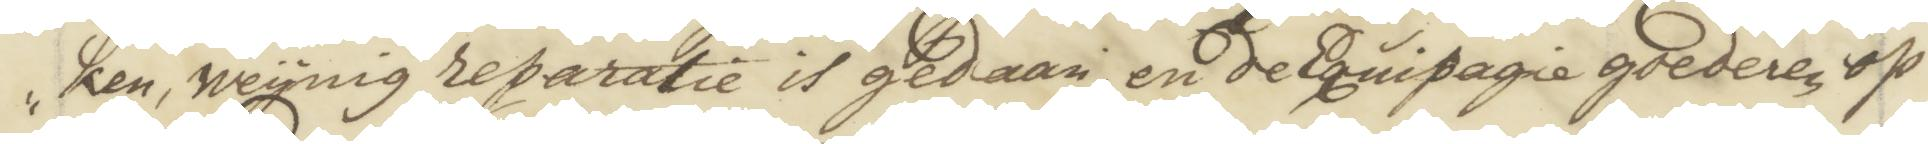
„ken, weijnig reparatie is gedaan, en de Equipagie goederen op
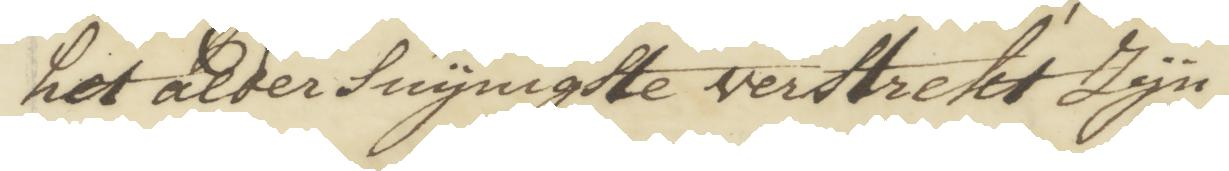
het alder suijnigste verstrekt zijn
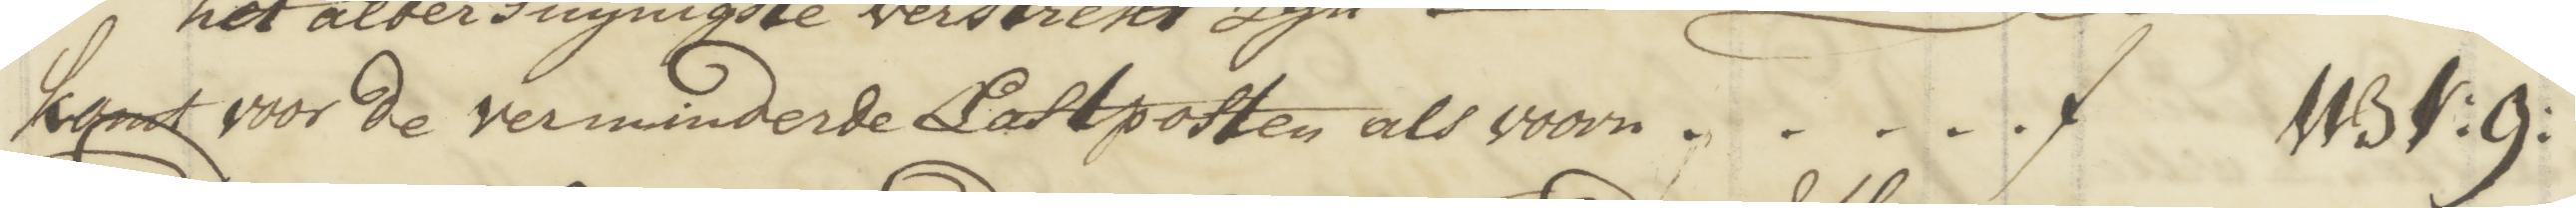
komt voor de verminderde Lastposten als voorn - - - - - ƒ 1131: 9:
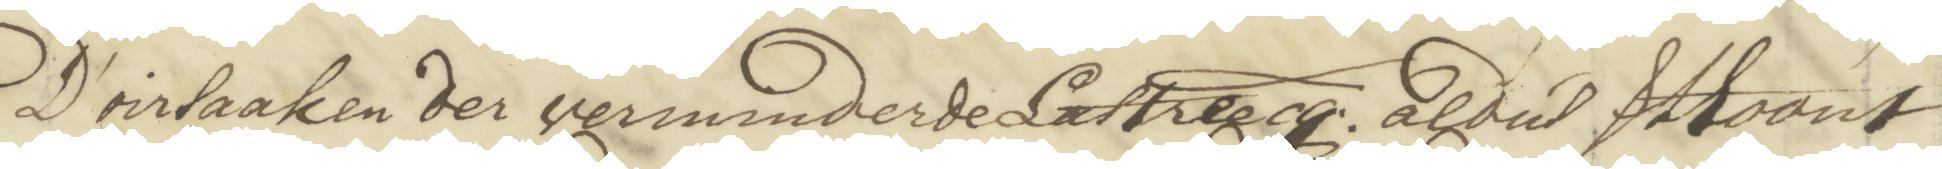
D’ oirsaaken der verminderde Lastreecq: aldus verthoont
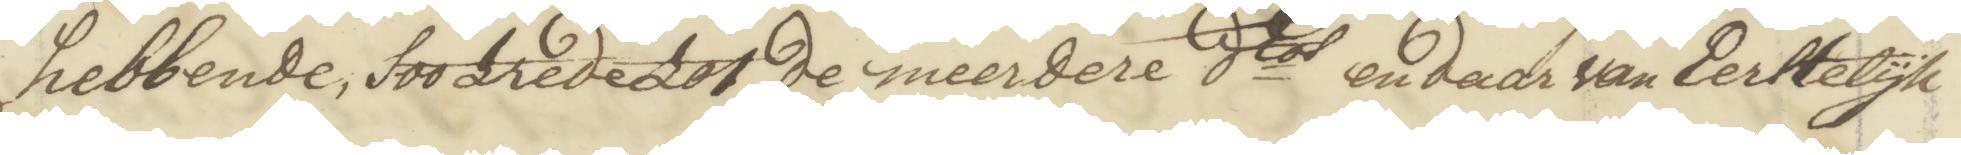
hebbende, soo trede tot de meerdere d=os en daar van Eerstelijk
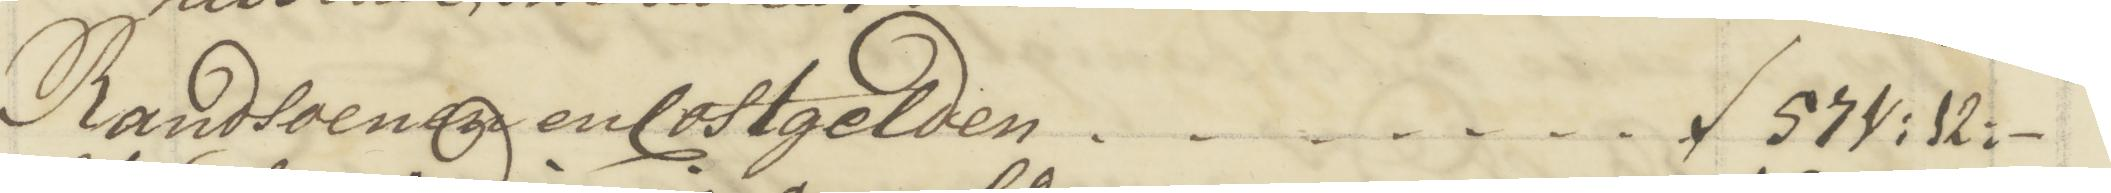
Randsoenen en costgelden - - - - - - - - ƒ 571: 12: —
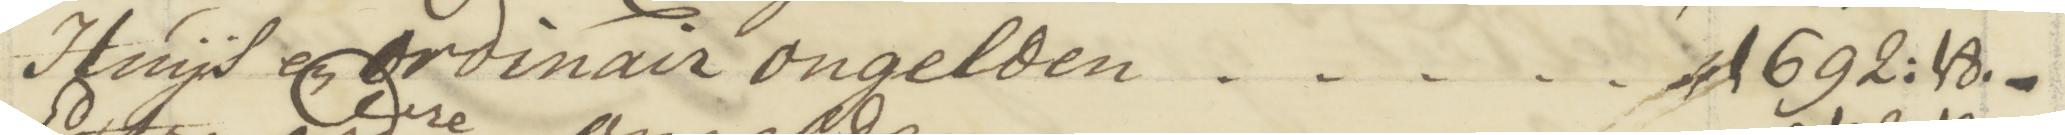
Huijs en ordinair ongelden - - - - - „1692: 18. —
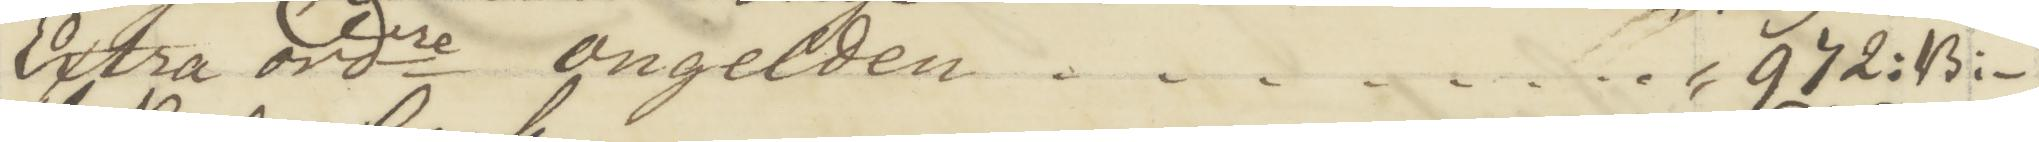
Extra ord=re ongelden - - - - - - - - „ 972: 13: —
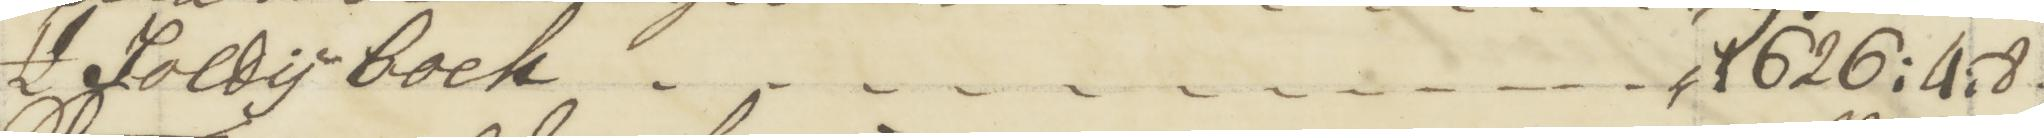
't soldij boek - - - - - - - - - - - - „1626: 4: 8.
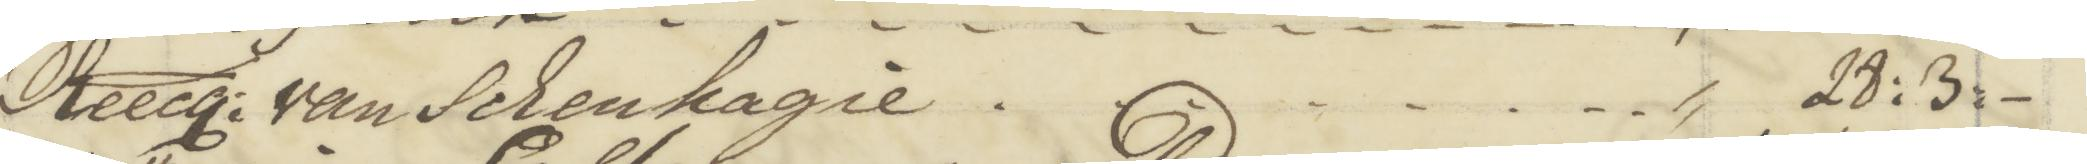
Reecq: van Schenkagie - - - - - - - - „ 28: 3 : —
